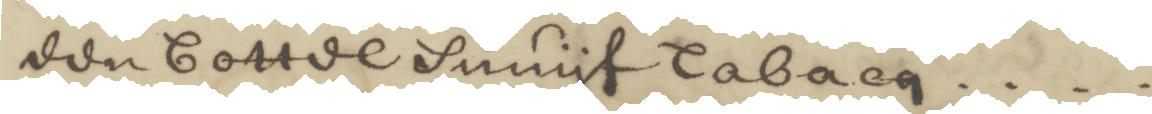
een bottel snuijf Tabacq - - -
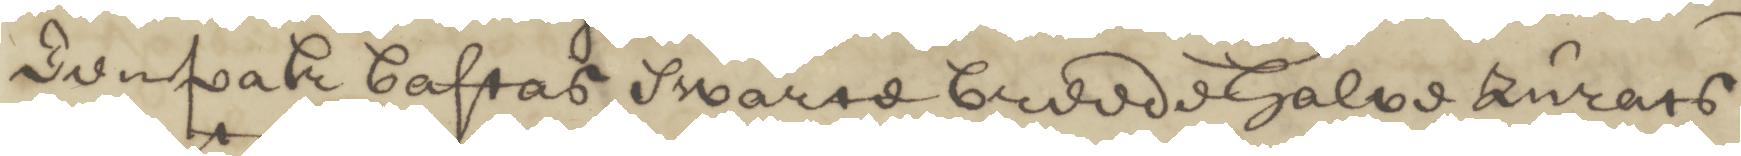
Een pak bastas swarte breede halve zurats
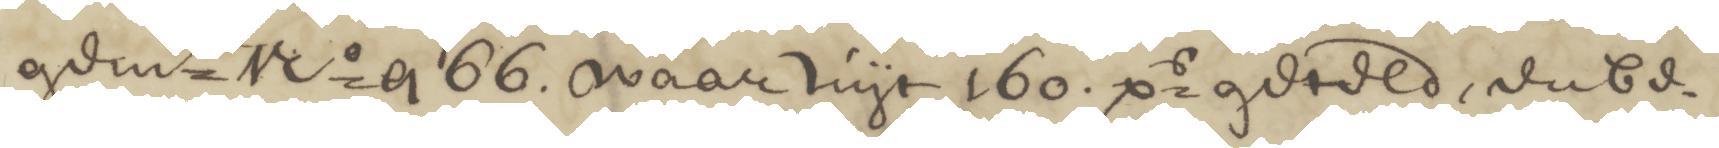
gem=t N=o 466. waar uijt 160. p=s geteld, en be„
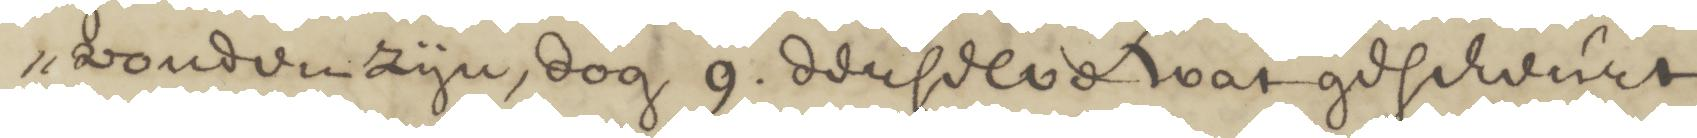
„vonden zijn, dog 9. derselve wat gescheurt
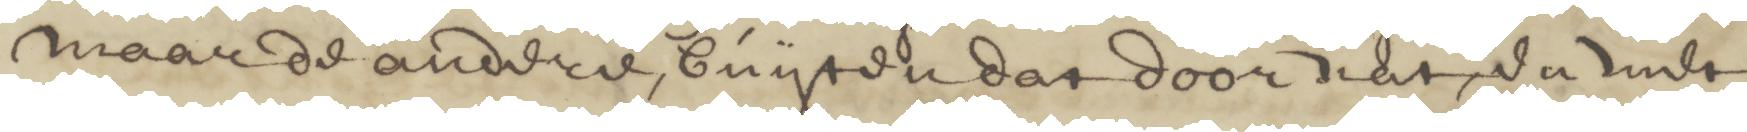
Maar de andere, buijten dat door nat, en met
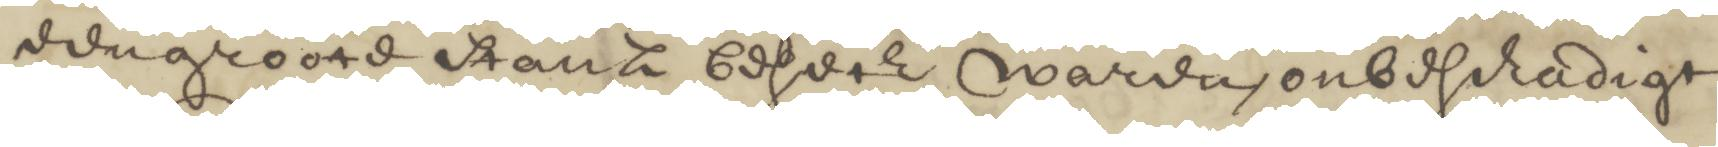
een groote stank beseth waren, onbeschadigt
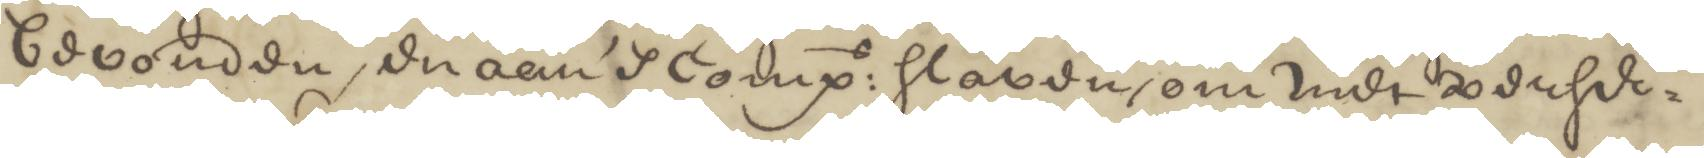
bevonden, en aan ’s Comp:s slaven, om met versch„
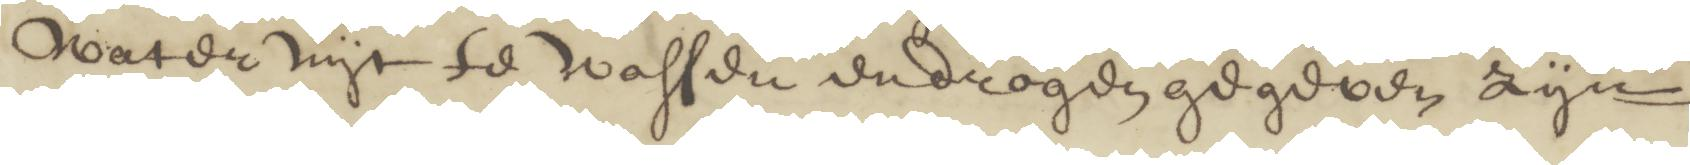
Water uijt te wassen en drogen gegeven zijn
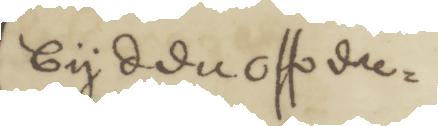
bij den opper„
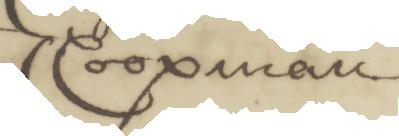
} Coopman
